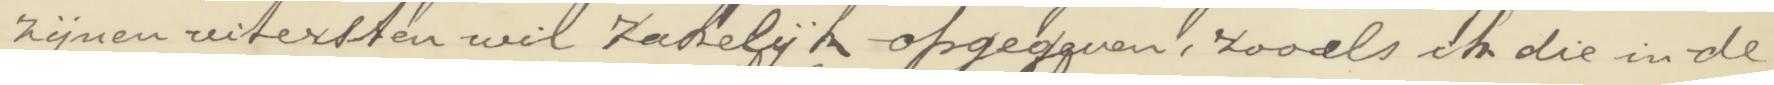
zijnen uitersten wil zakelijk opgegeven, zooals ik die in de
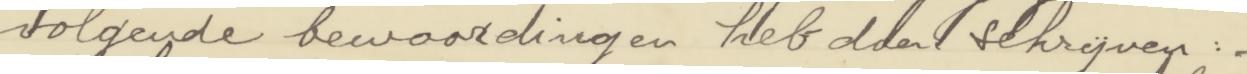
volgende bewoordingen heb doen schrijven:
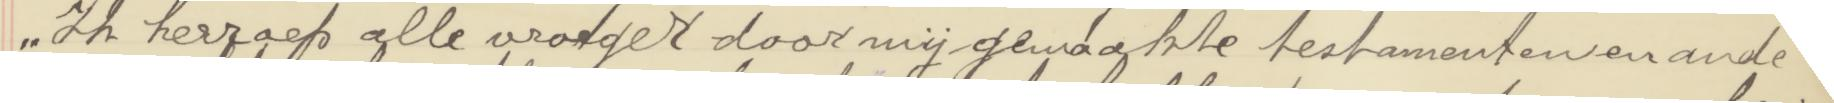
„ Ik herroep alle vroeger door mij gemaakte testamenten en ande:
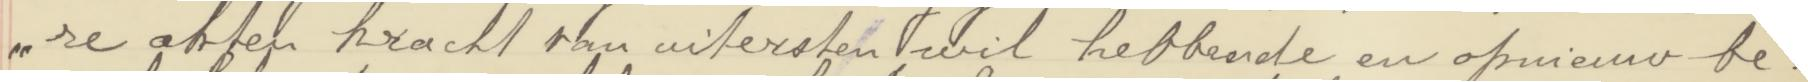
„ re akten kracht van uiterstent wil hebbende en opnieuw be:
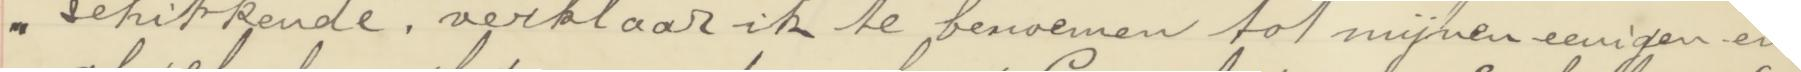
„ schikkende, verklaar ik te benoemen tot mijnen eenigen en
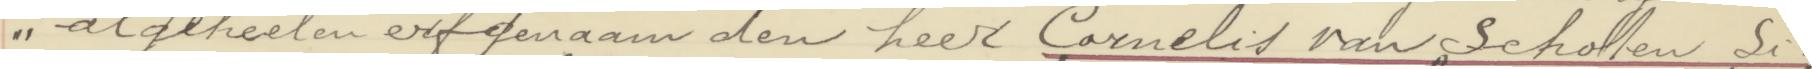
„ algeheelen erfgenaam den heer Cornelis van Scholten Si
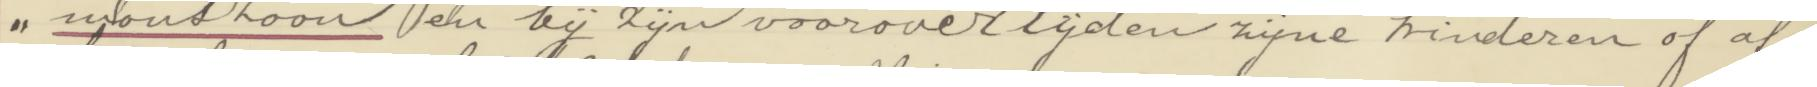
„ monszoon en bij zijn vooroverlijden zijne kinderen of af:
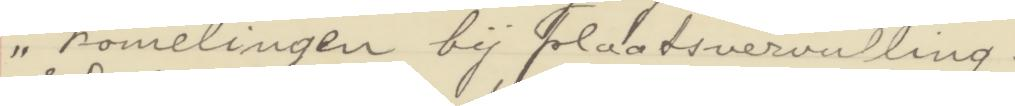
„ komelingen bij plaatsvervulling
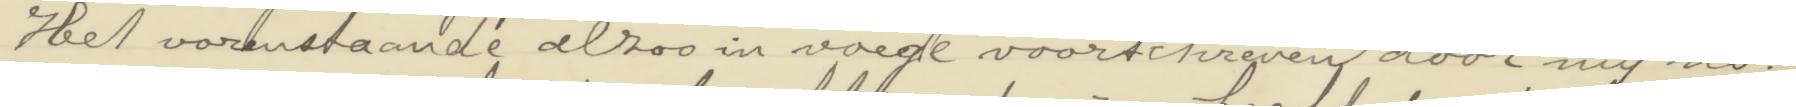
Het vorenstaande alzoo in voege voorschreven door mij no:
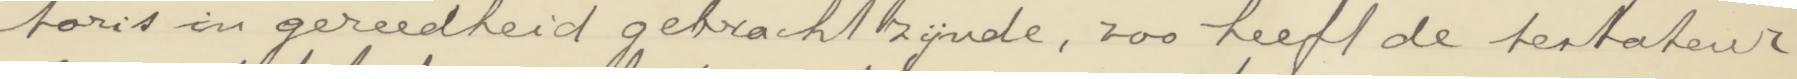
taris in gereedheid gebracht zijnde, zoo heeft de testateur
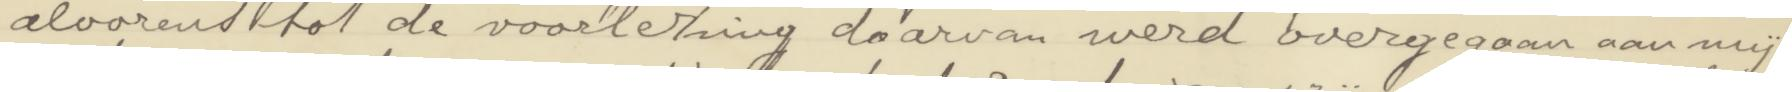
alvorens tot de voorlezing daarvan werd overgegaan aan mij
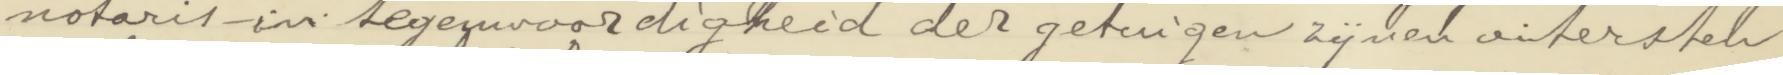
notaris in tegenwoordigheid der getuigen zijnen uitersten
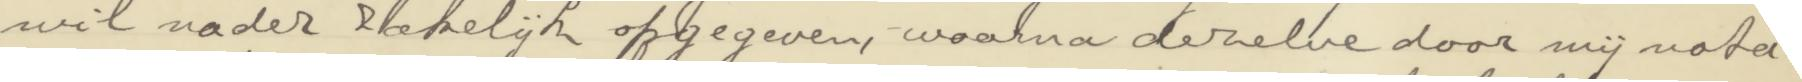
wil nader zakelijk opgegeven, waarna dezelve door mij nota
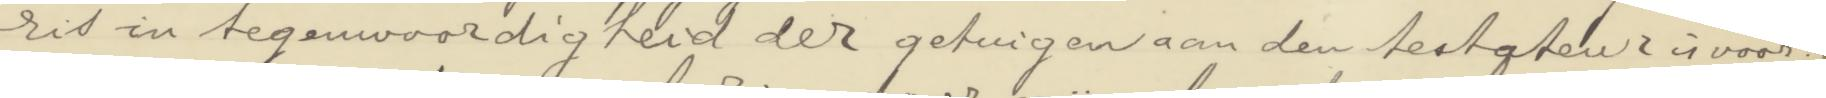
ris in tegenwoordigheid der getuigen aan den testateur is voor:
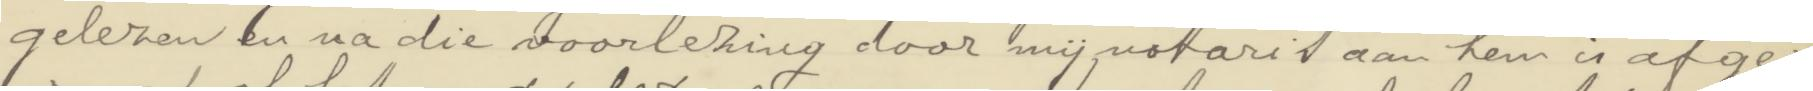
gelezen en na die voorlezing door mij notaris aan hem is afge:
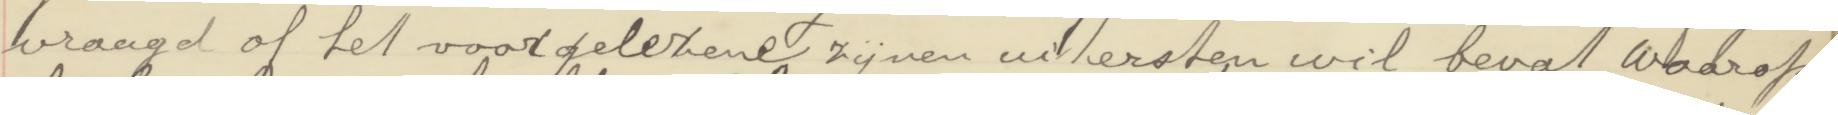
vraagd of het voorgelezene zijnen uitersten wil bevat waarop
